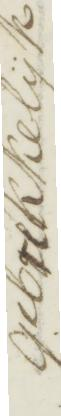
gebrekkelijk
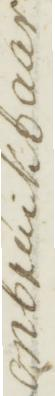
onbruikbaar
